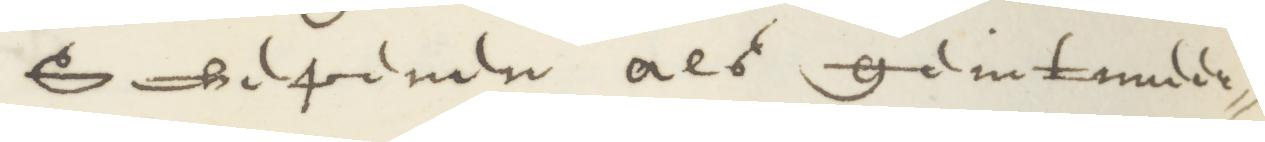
Schepenen als geintimeer„
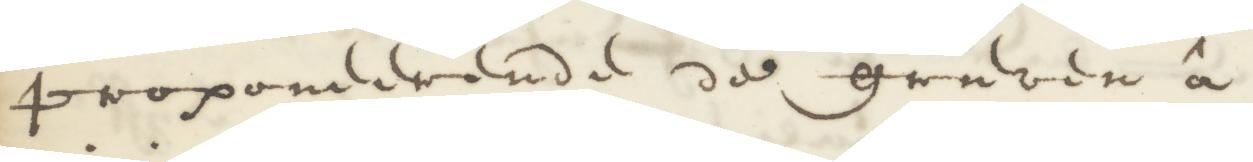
proponeerende de grieven â
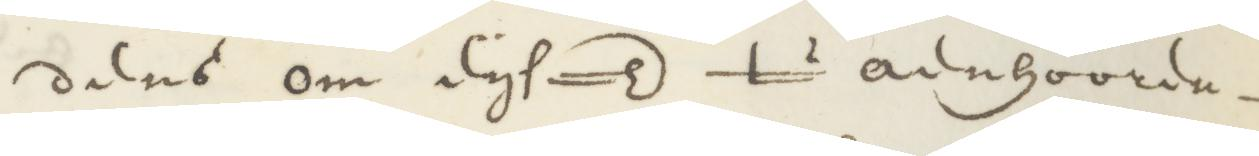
dens om eijsch t' aenhooren-
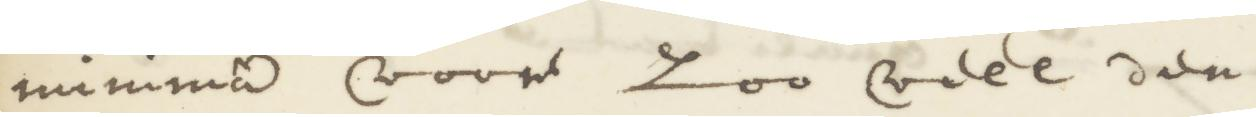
minimâ voor zoo well den
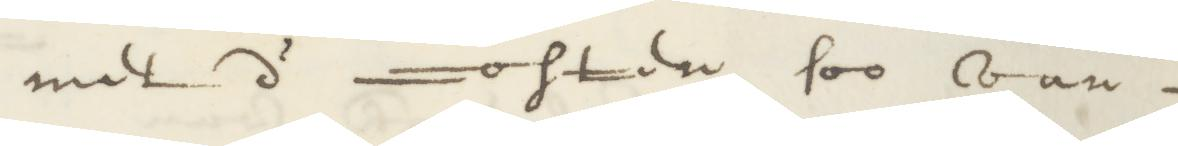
met d’ costen soo van
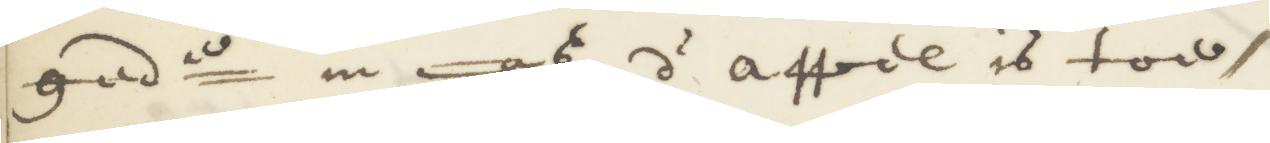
ged=e in cas d’ appel is toe„
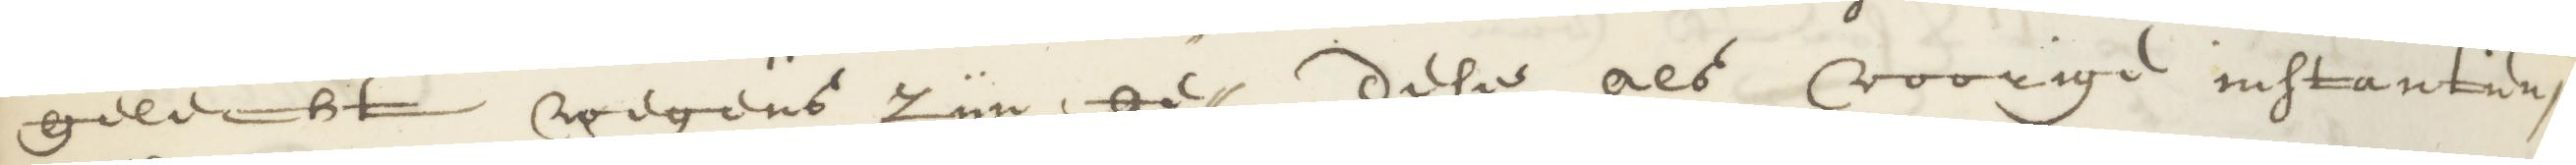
gelecht wegens zijn ge„ dese als voorige instantien,
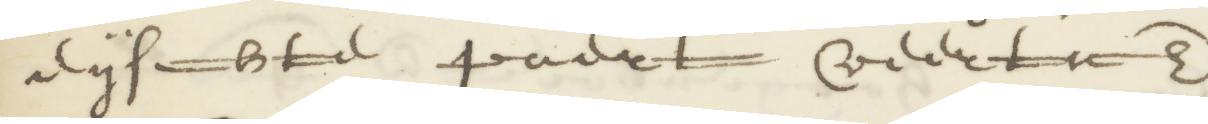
eijschte paert veertich
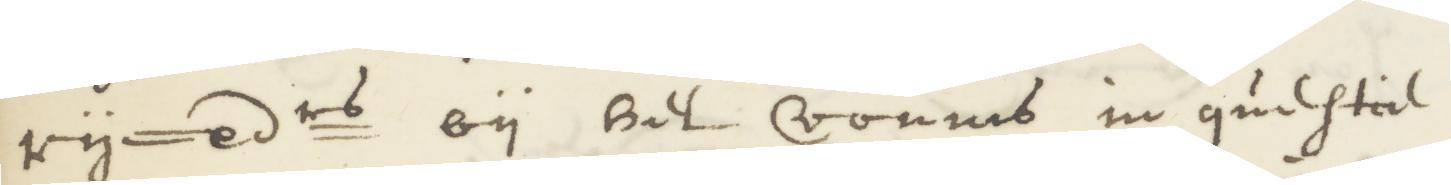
rijcxd=rs bij het vonnis in questie
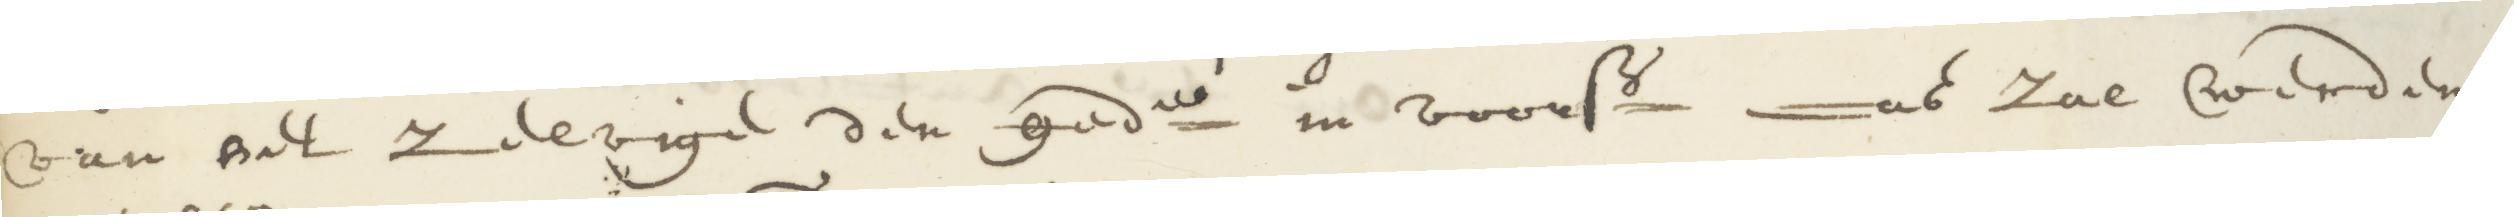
van het zelvige der ged=te in voors=z cas zal werden
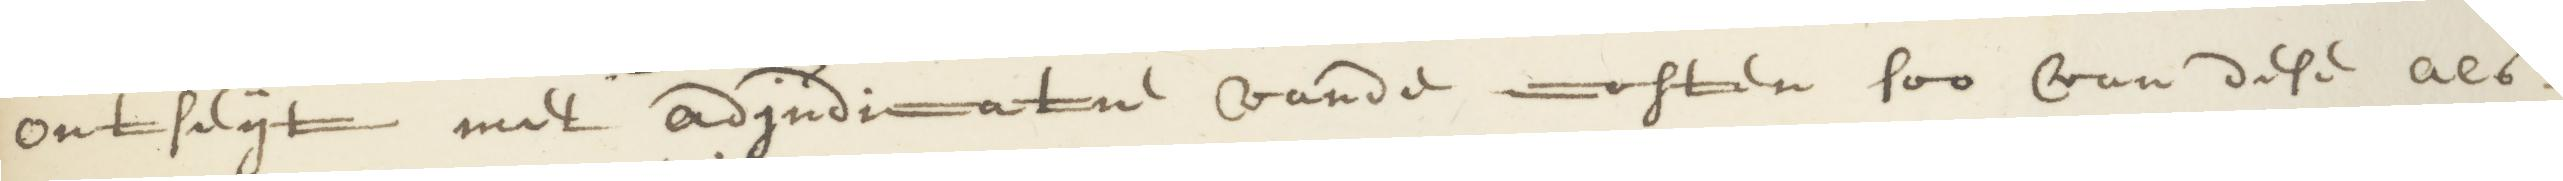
ontseijt met adjudicatie van de costen soo van dese als
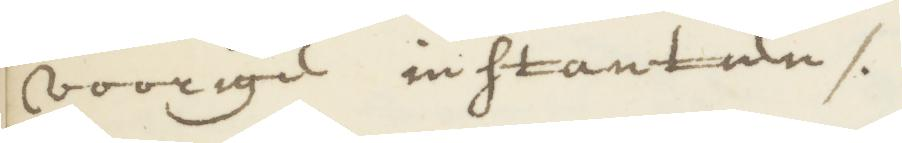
voorige instantien/.
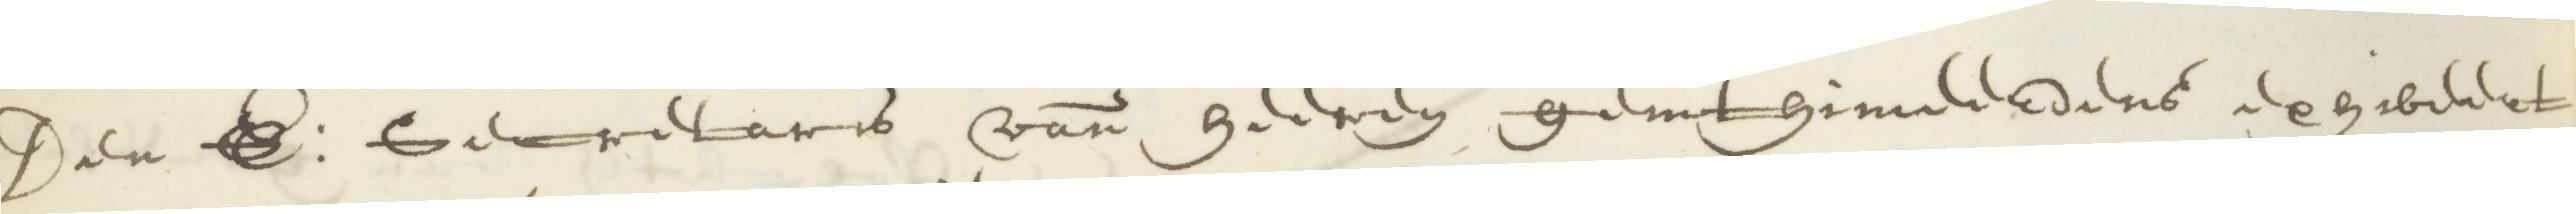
Den E: Secretaris van heeren geinthimeerdens exhibeert
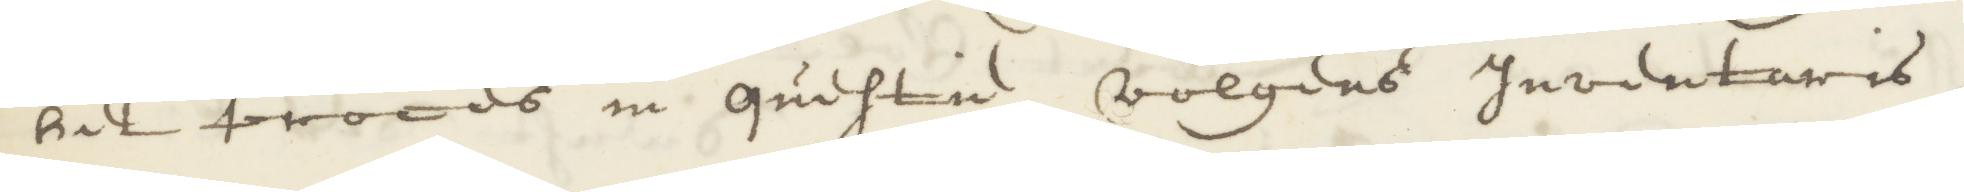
het proces in questie volgens Jnventaris
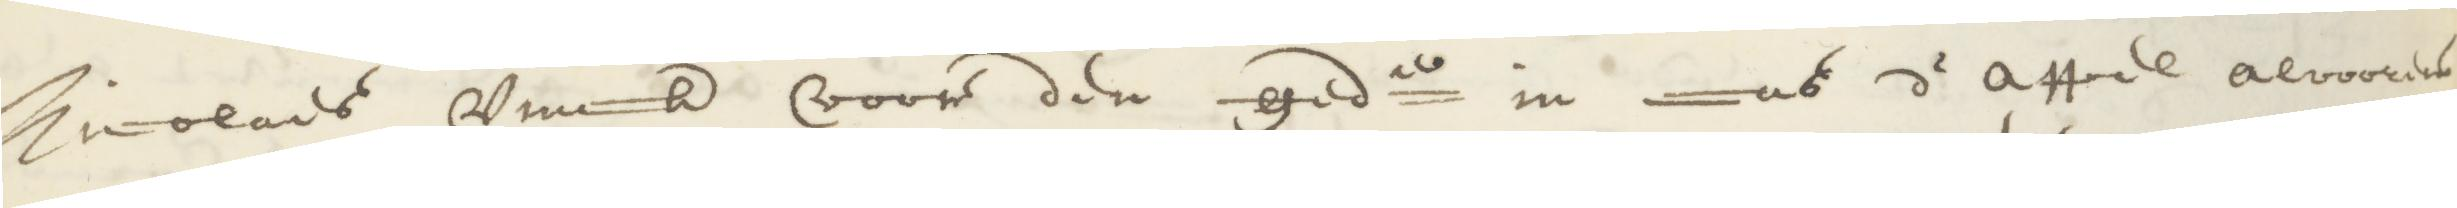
Nicolaes Vinck voor den ged=e in cas d'appel alvoorens
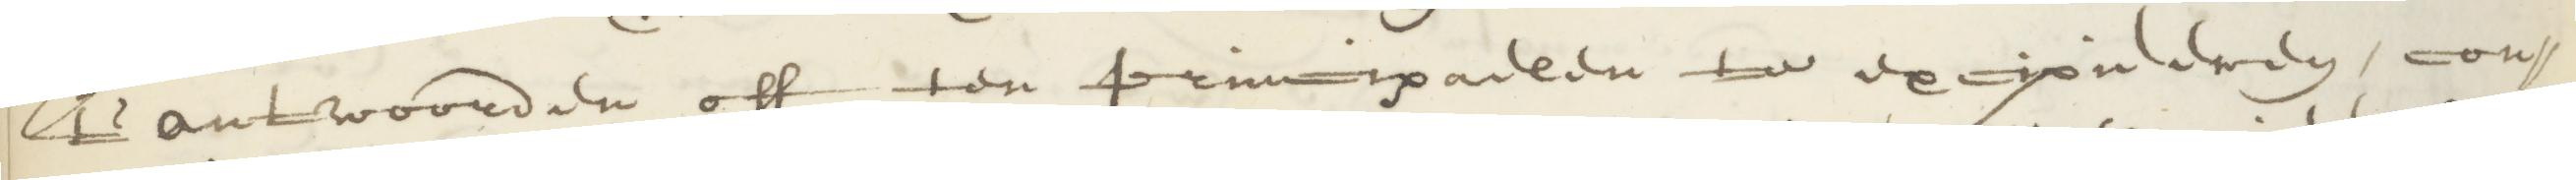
t' antwoorden off ten principaelen te excipieeren, con„
